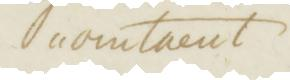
omtrent
